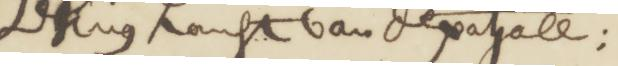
terug komst van de patjall:
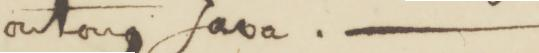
ontong Java. —
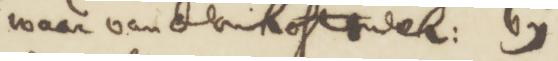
waar van de onkosttreek: bij
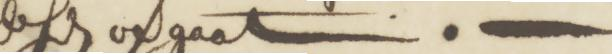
desen overgaat. —
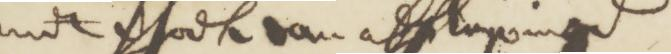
met versoek van afschrijvinge
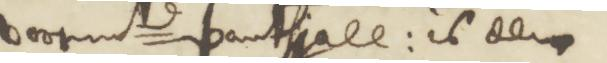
voorm=te pantsjall: is den
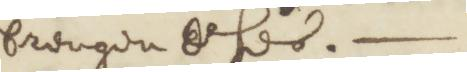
brenger deses. —
